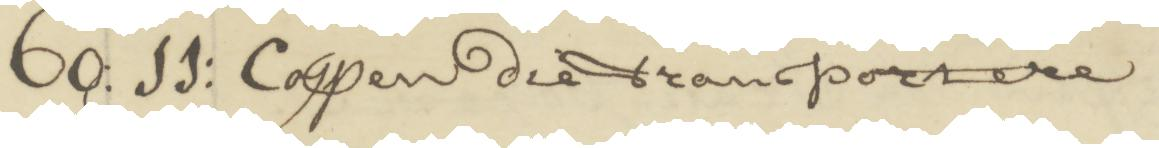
60: 11: Coppen die transportere
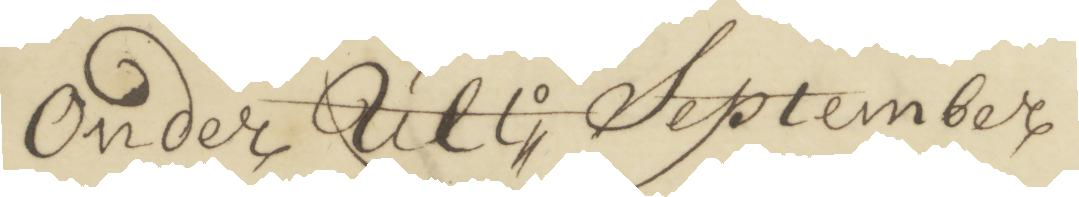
Onder Ult„o September
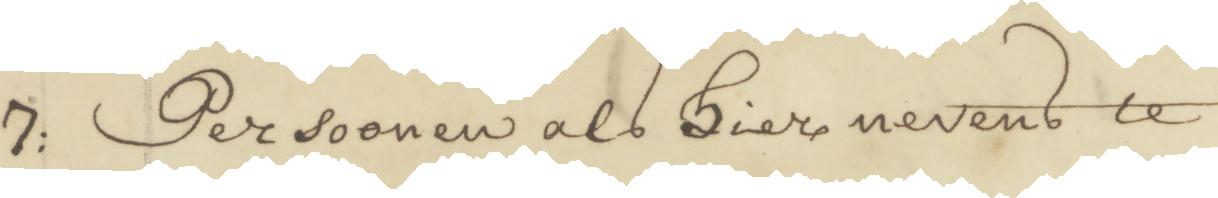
7: Persoonen als hier nevens te
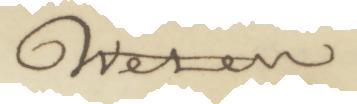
Weten
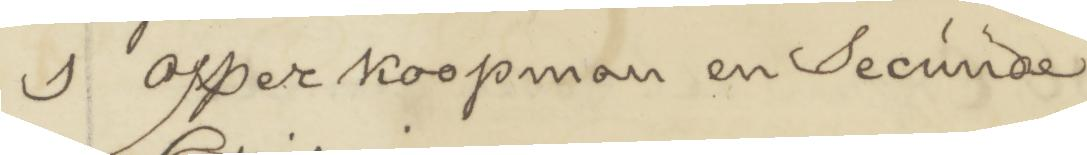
1 opper koopman en secunde
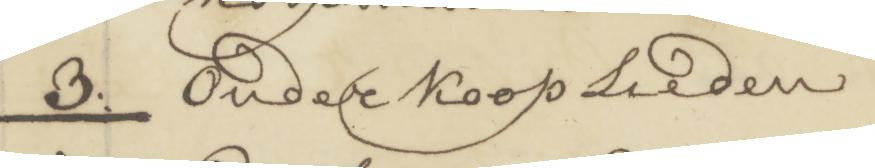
3: onder kooplieden
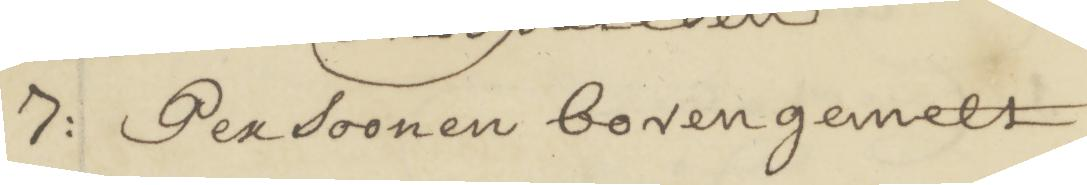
7: Persoonen bovengemelt
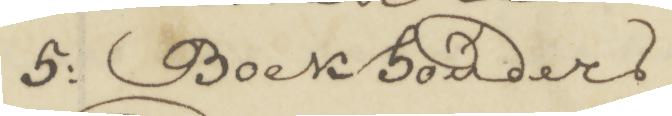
5: Boekhouders
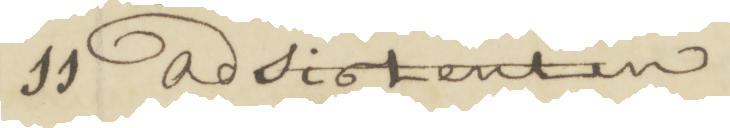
11 adsistenten
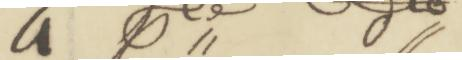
4 p„le d„to
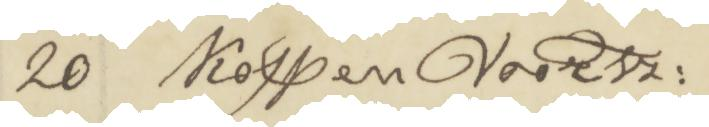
20 Koppen Voorsz:
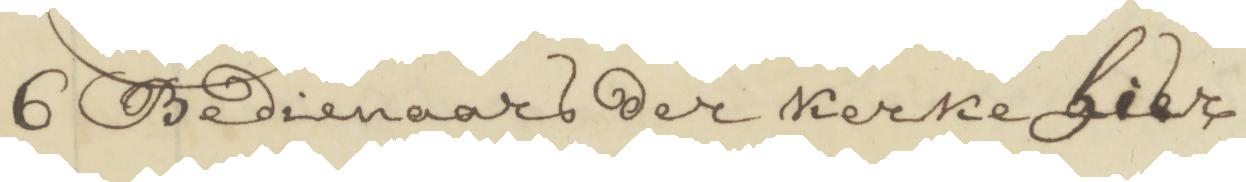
6 Bedienaars der kerke hier
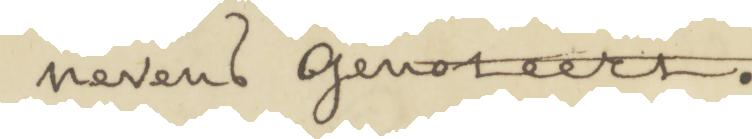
nevens genoteert.
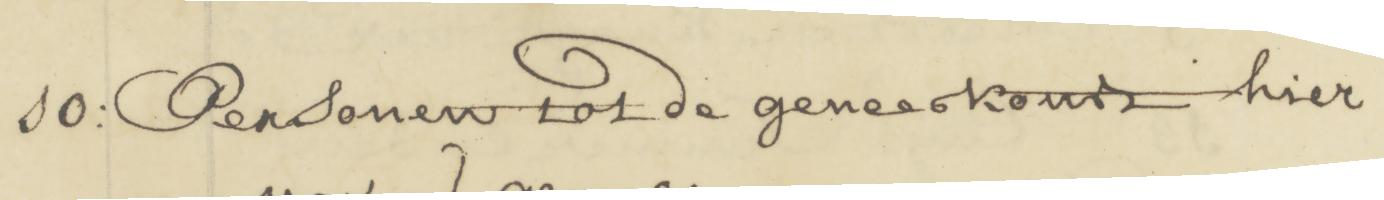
10: Personen tot de geneeskonst hier
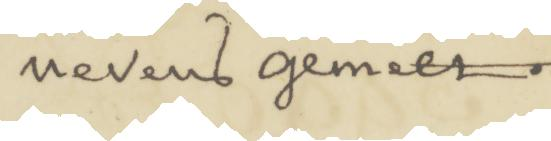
nevens gemelt.
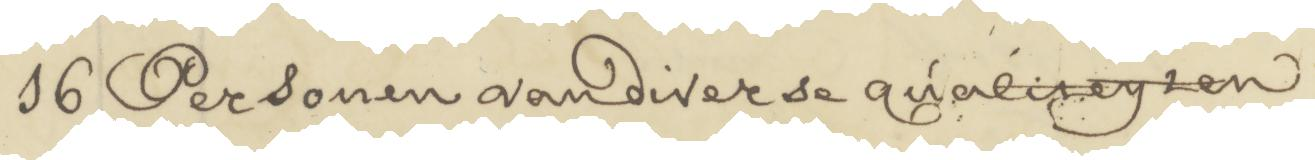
16 Personen van diverse qualiteyten
